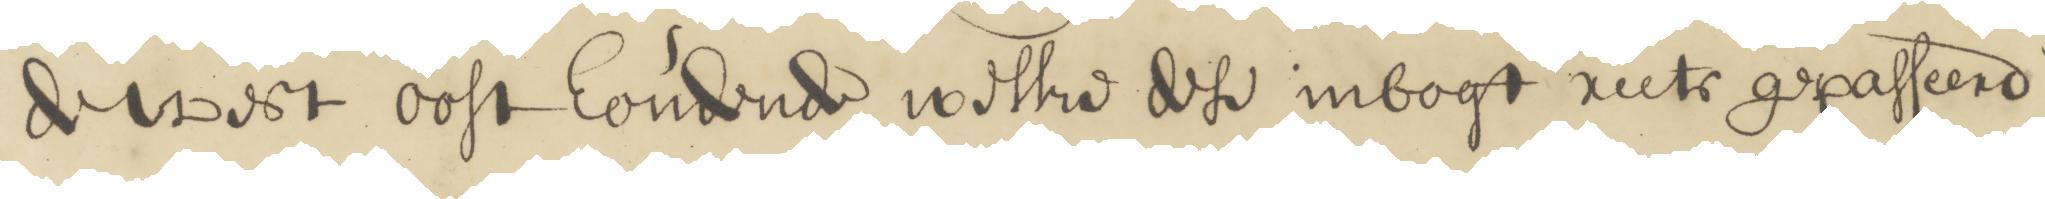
de west oost houdende, welke dese inbogt reets gepasseerd
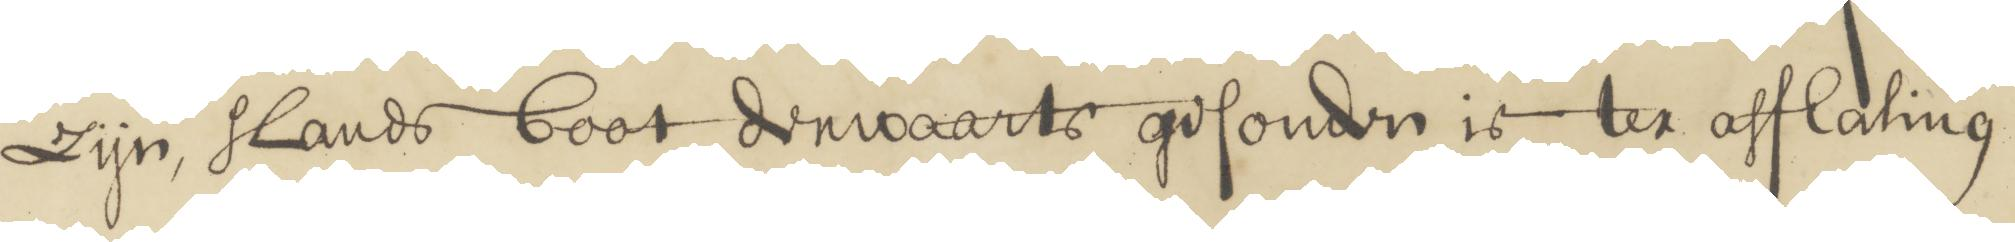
zijn, 'slands boot derwaarts gesonden is, ter afhaling
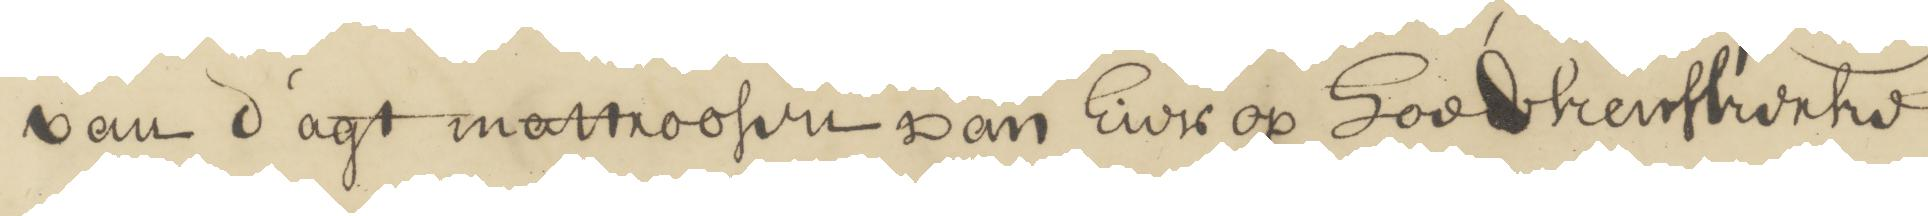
van d’agt mattroosen van hier op hoedekenskerke
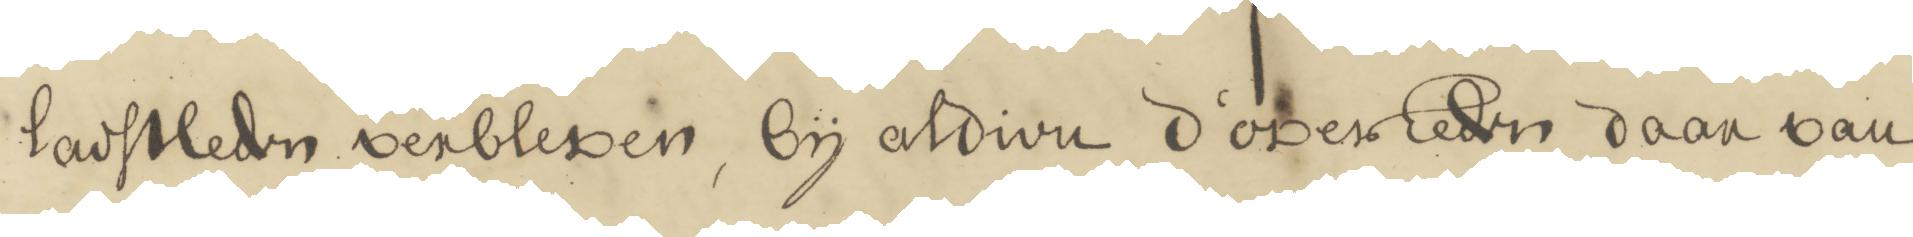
laestleden verbleven, bij aldien d’overheden daar van
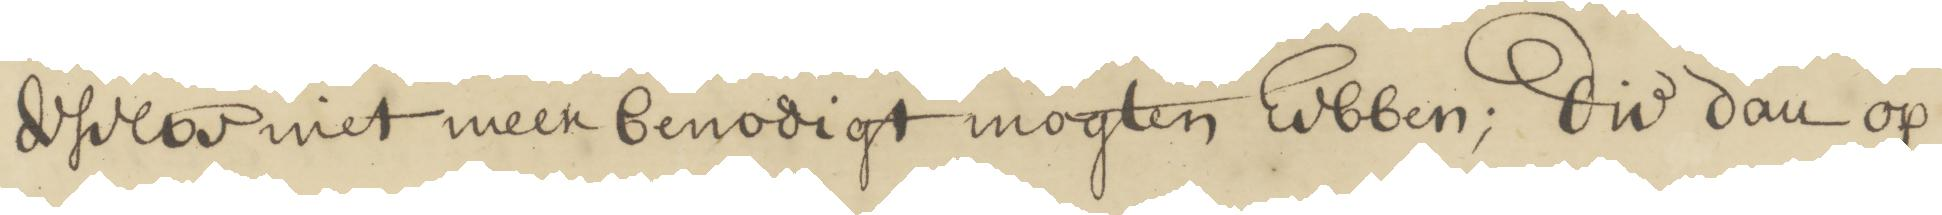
deselve niet meer benodigt mogten hebben; die dan op
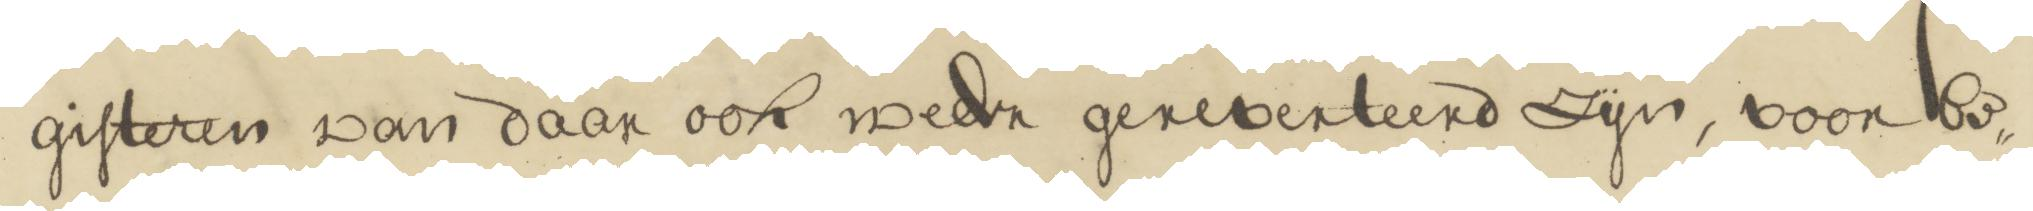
gisteren van daar ook weder gereverteerd zijn, voor be„
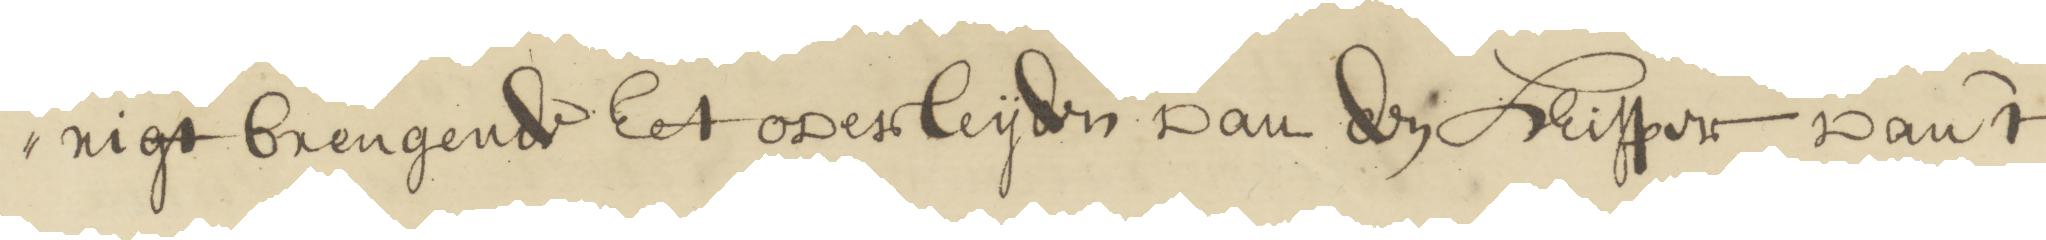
„rigt brengende het overleijden van den schipper van ’t
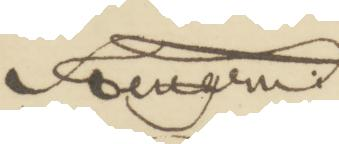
Evengem:
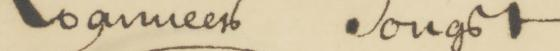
wanneer Jongst
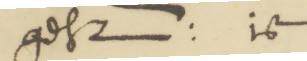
gesz: is
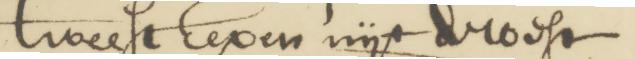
twee schepen uijt de west,
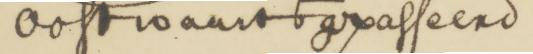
oostwaarts gepasseerd
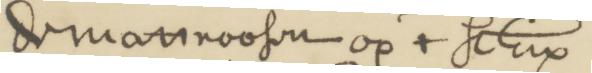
de mattroosen op ’t schip
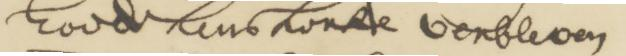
hoedekenskerke verbleven
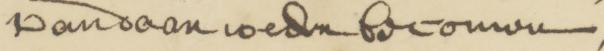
van daar weder becomen
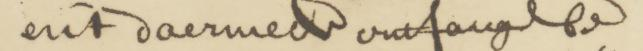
en't daermede ontfange be
